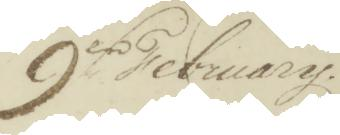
9„en February.
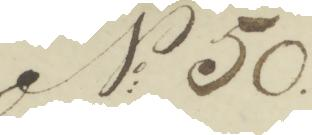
N:o 50.
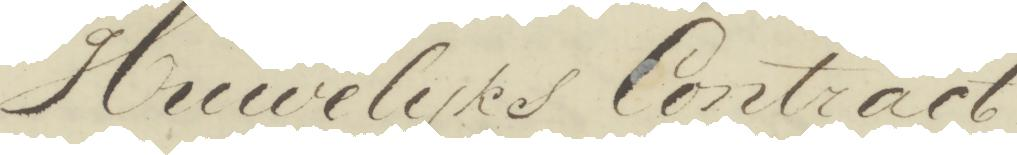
Huwelyks Contract
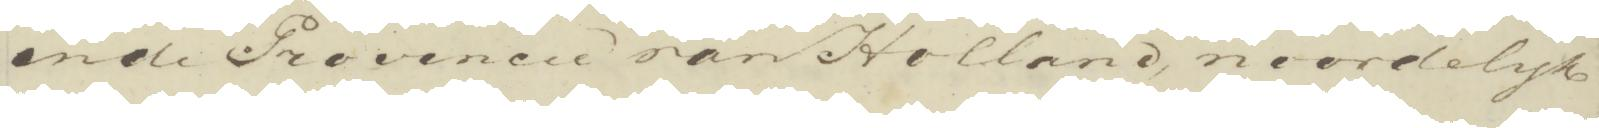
inde Provincie vanHolland, noordelyk
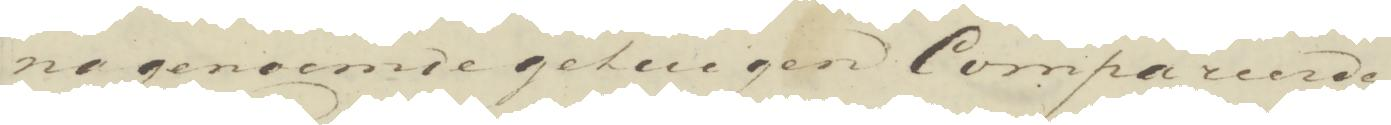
na genoemde getuigen Compareerden
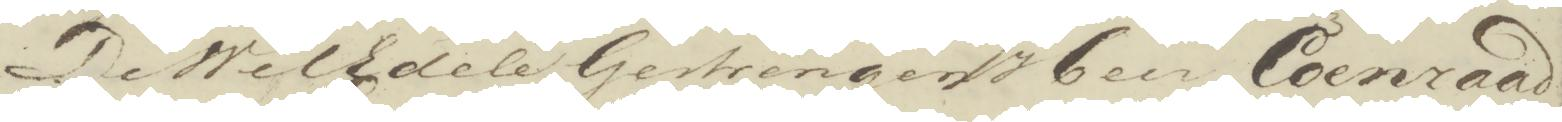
De WelEdele Gestrengen Heer Coenraad
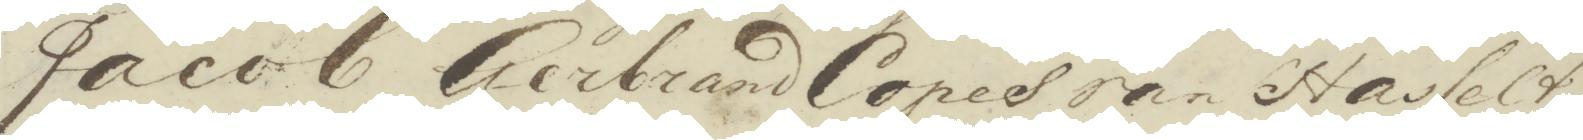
Jacob Gerbrand Copes van Hasselt,
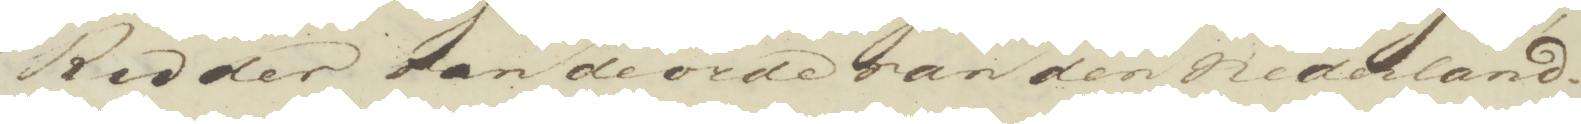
Ridder in de orde van den Nederland
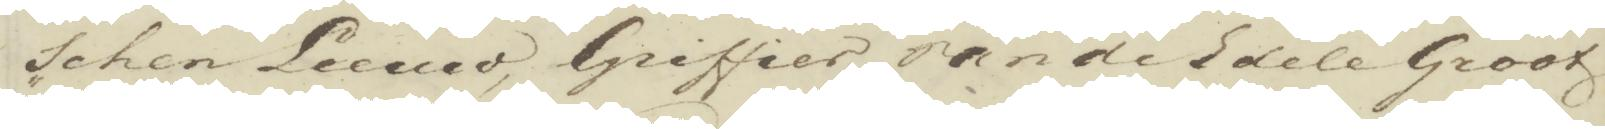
schen Leeuw, Griffier van de Edele Groot
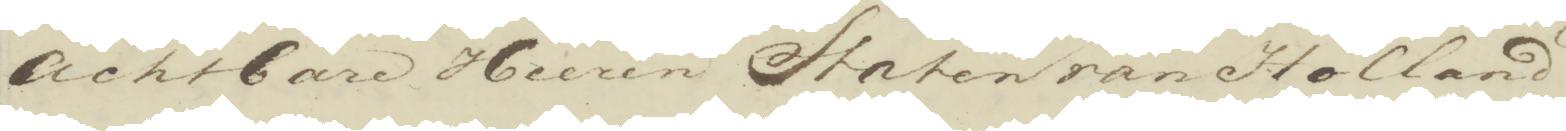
Achtbare Heeren Staten van Holland
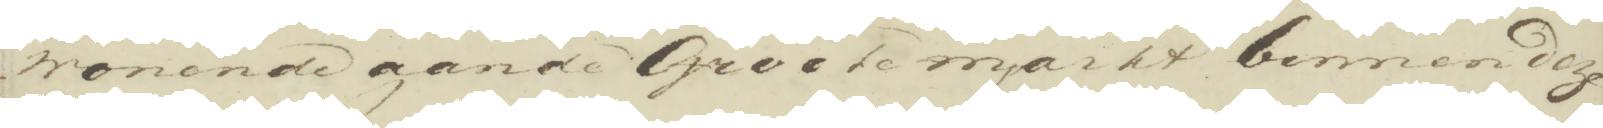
wonende aan de Groote markt binnen deze
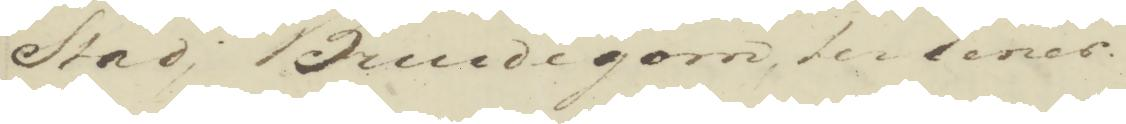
Stad, Bruidegom, ter Eener.
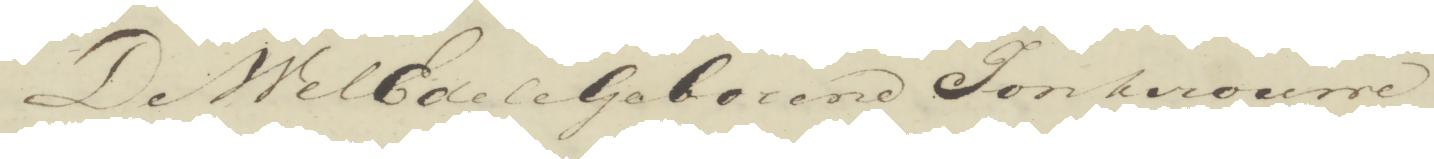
De WelEdele Geborene Ionkvrouwe
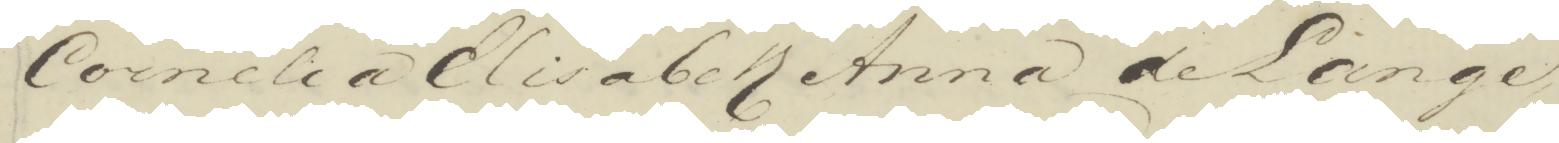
Cornelia Elisabeth Anna de Lange,
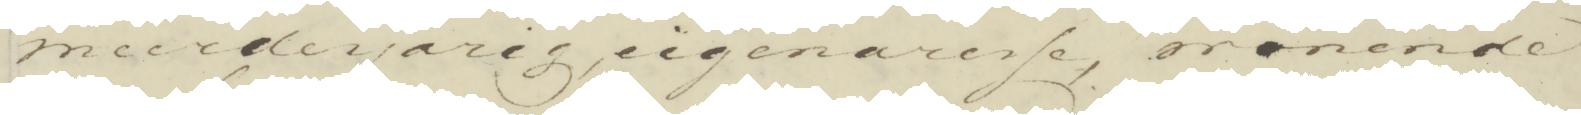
meerderjarig, eigenaresse, wonende
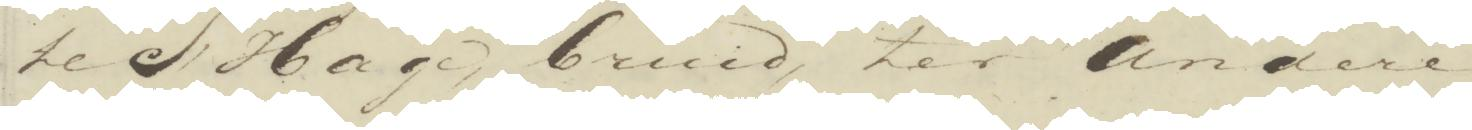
te S'Hage, bruid, ter Andere
